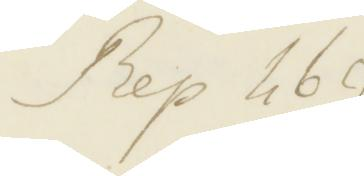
Rep 469
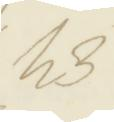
18-2 43
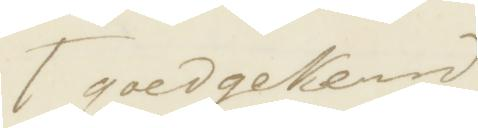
¶ goedgekeurd
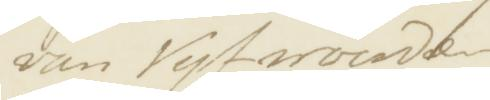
van vyf woorden
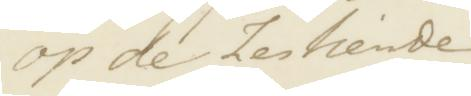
op de Zestiende
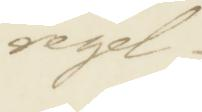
regel
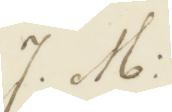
J. M:
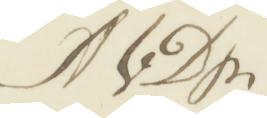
A V D j-r
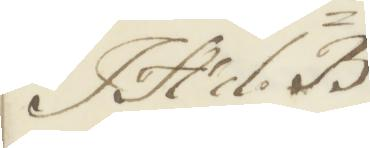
I A d B
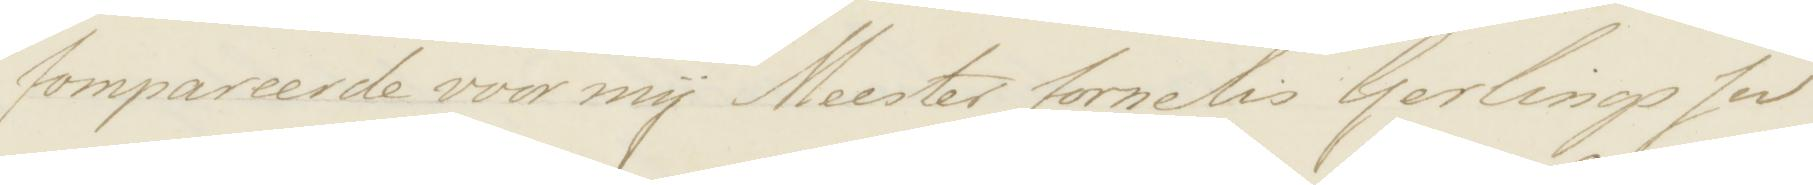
Compareerde voor mij Meester Cornelis Gerling Jn
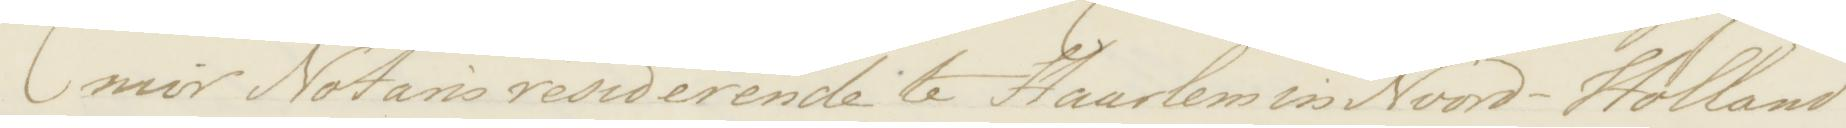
mir Notaris residerende te Haarlem in Noord-Holland
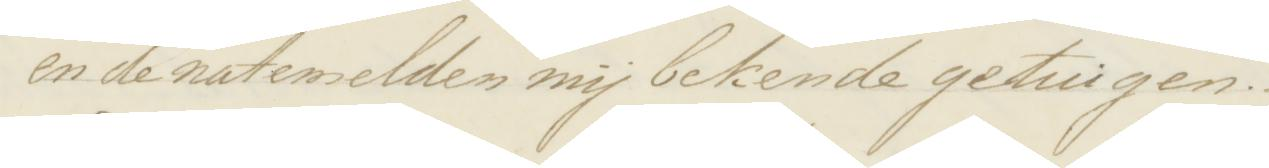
en de natemelden mij bekende getuigen.
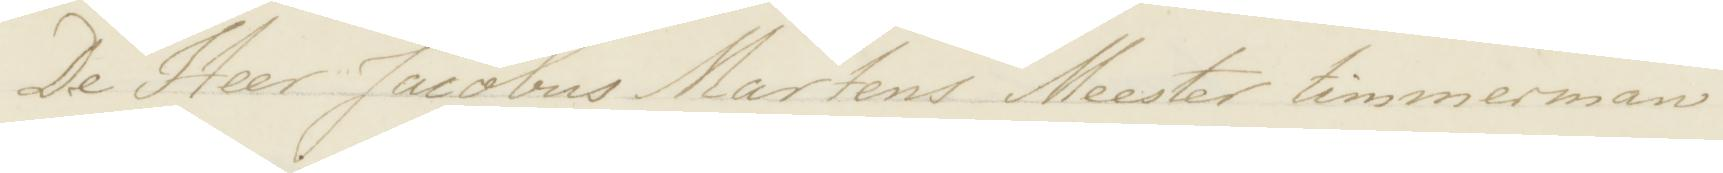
De Heer Jacobus Martens Meester timmerman
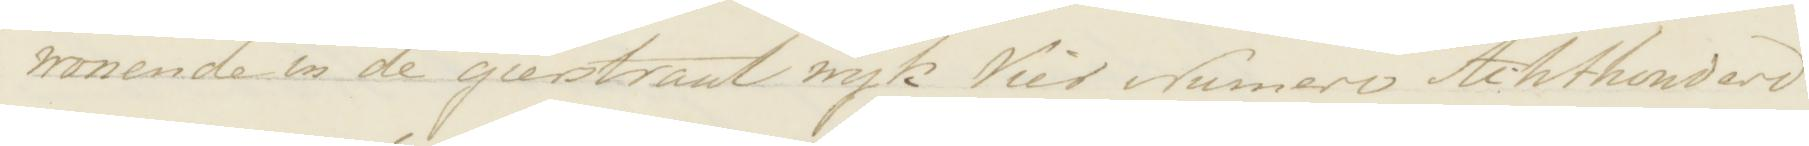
wonende in de giesstraat wyk Vier Numero Achthonderd
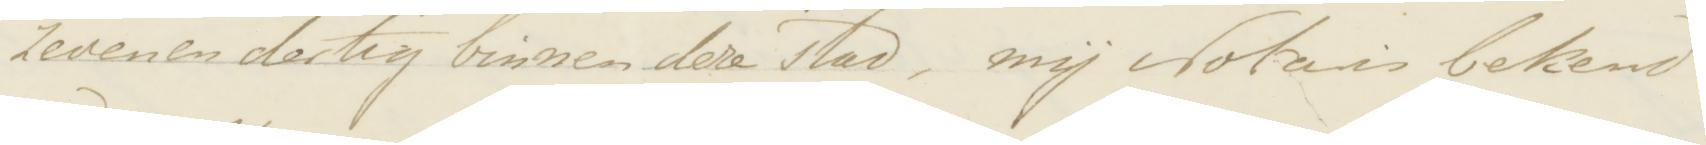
zevenen dertig binnen deze stad, mij Notaris bekend
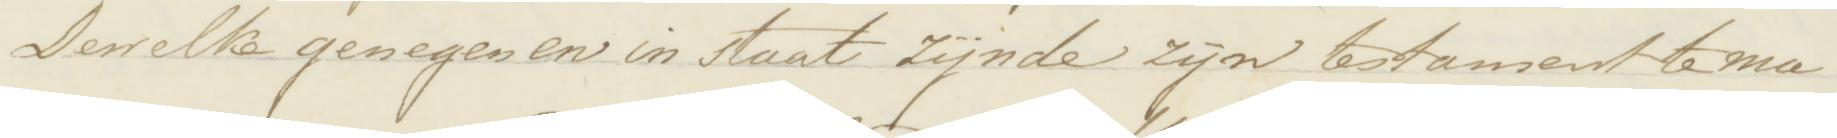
Dewelk genegen en in staat zijnde zijn testament te ma
